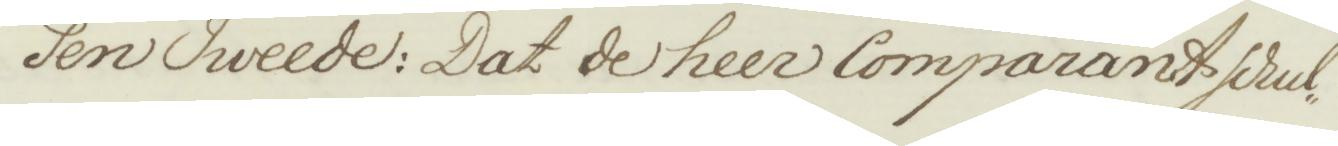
Ten Tweede: Dat de heer Comparant schul„
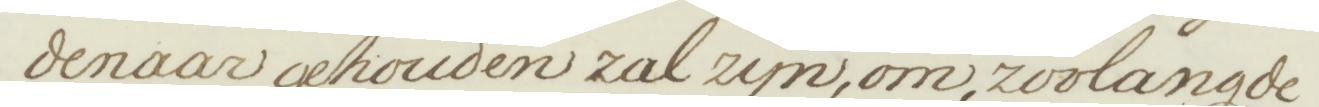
denaar gehouden zal zyn, om, zoolang de
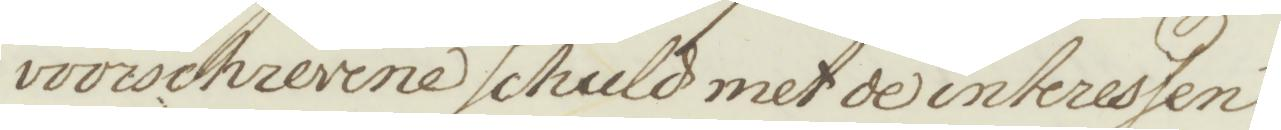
voorschrevene schuld met de interessen
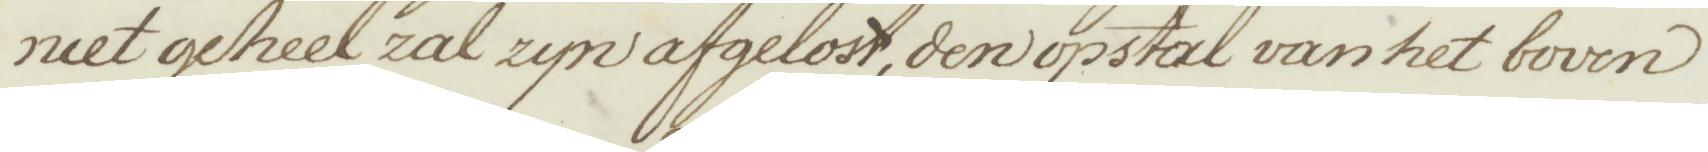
niet geheel zal zyn afgelost, den opstal van het boven
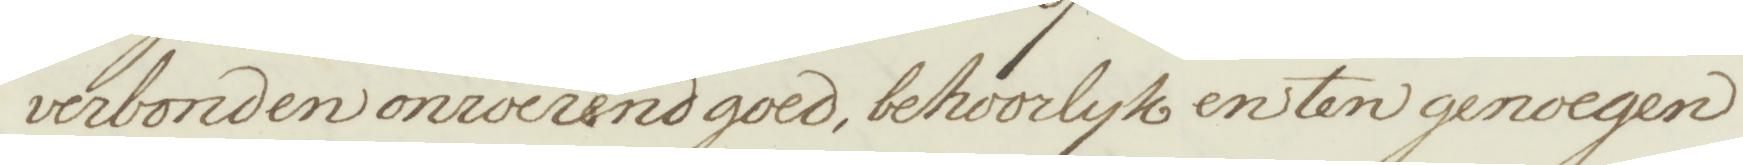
verbonden onroerend goed, behoorlyk en ten genoegen
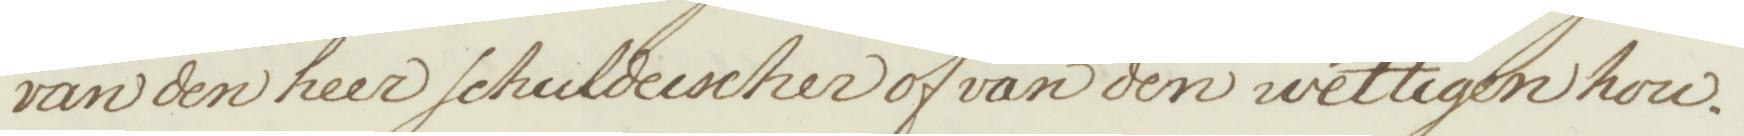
van den heer schuldeischer of van den wettigen hou„
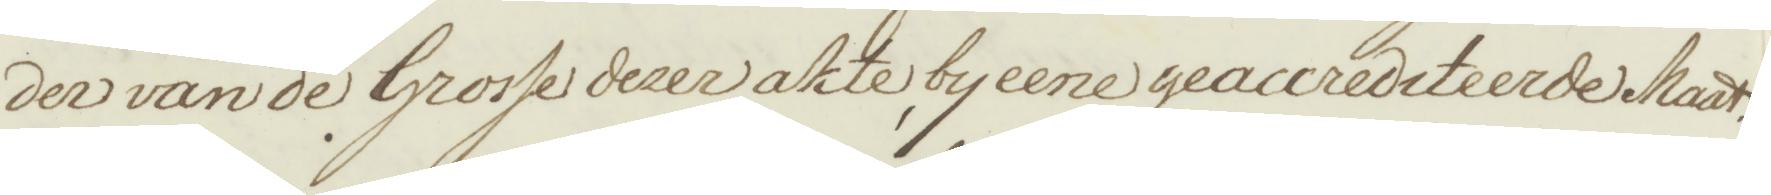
der van de Grosse dezer akte, bij eene geaccrediteerde Maat„
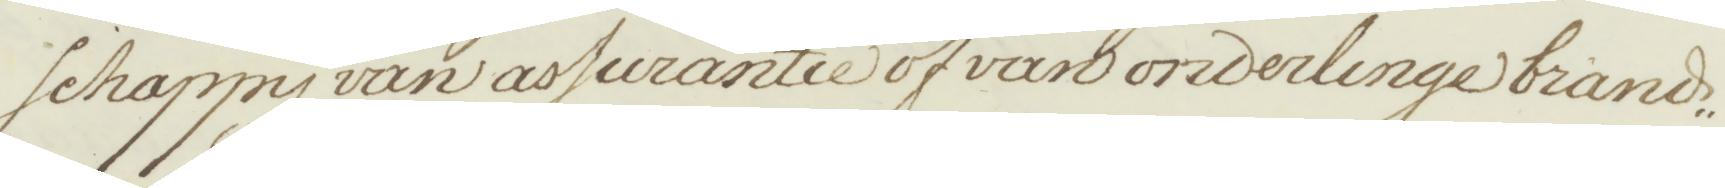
schappij van assurantie of van onderlinge brand„
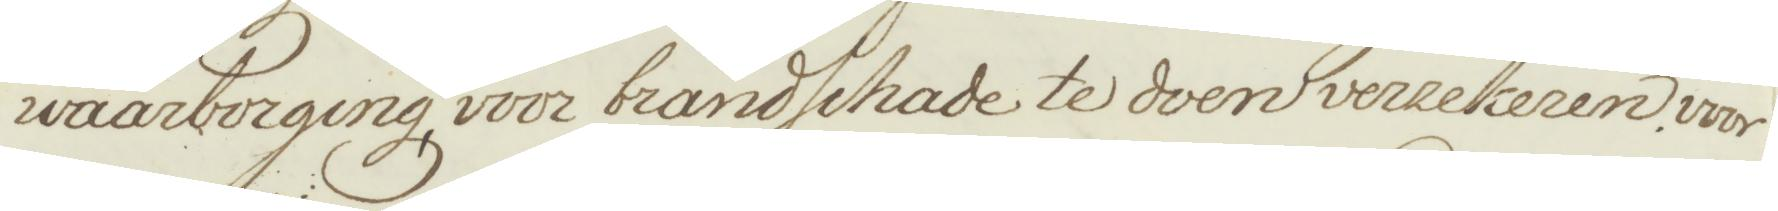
waarborging, voor brandschade te doen verzekeren, voor
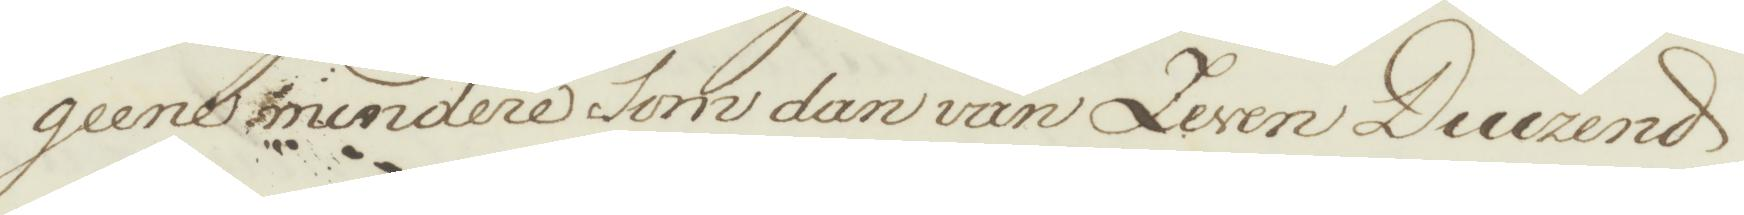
geene mindere som dan van Zeven Duizend
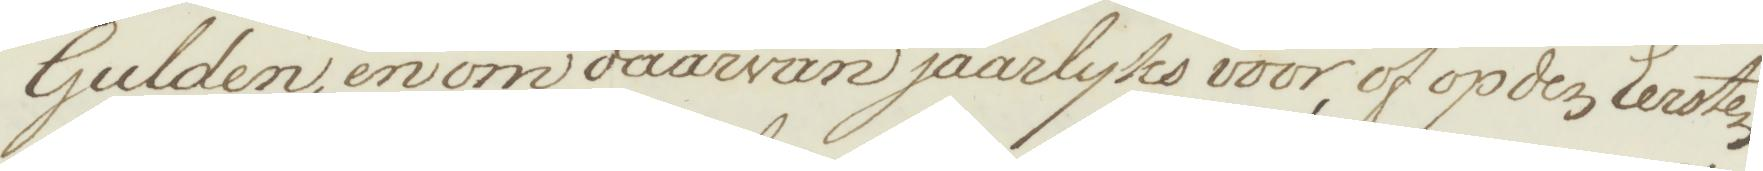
Gulden, en om daarvan jaarlyks vóór, of op den Eersten
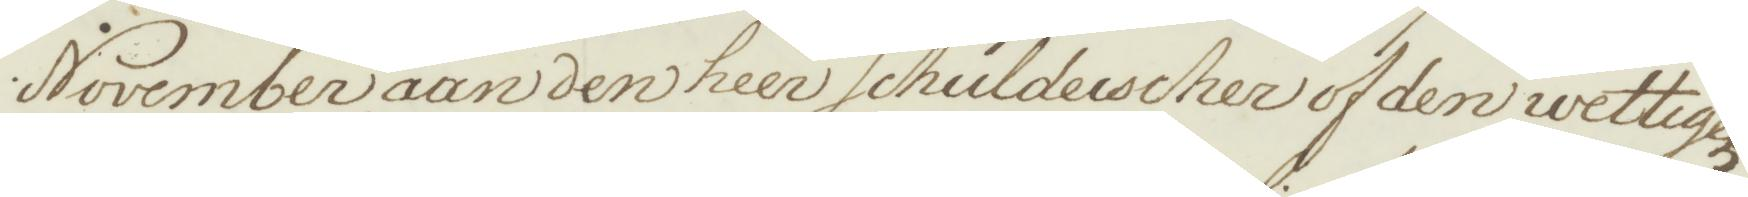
November, aan den heer schuldeischer of den wettigen
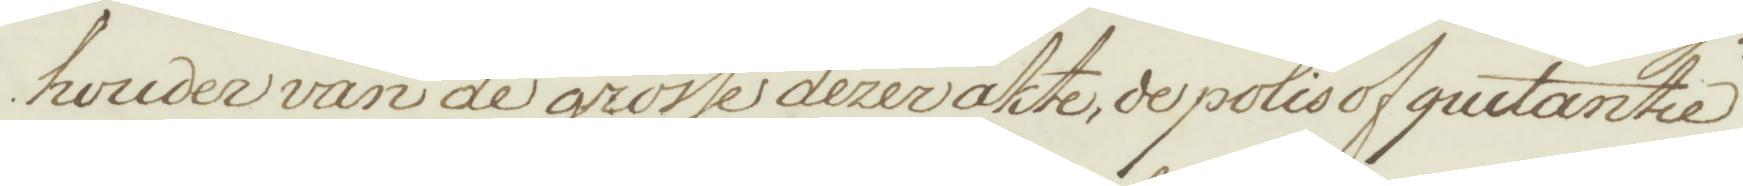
houder van de grosse dezer akte, de polis of quitantie
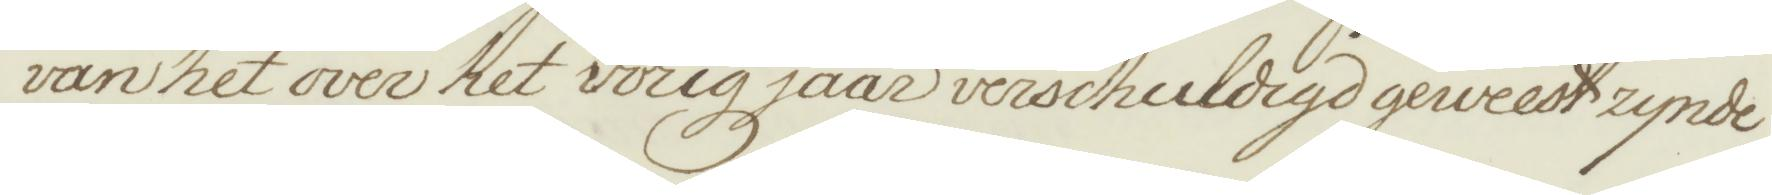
van het over het vorig jaar verschuldigd geweest zynde
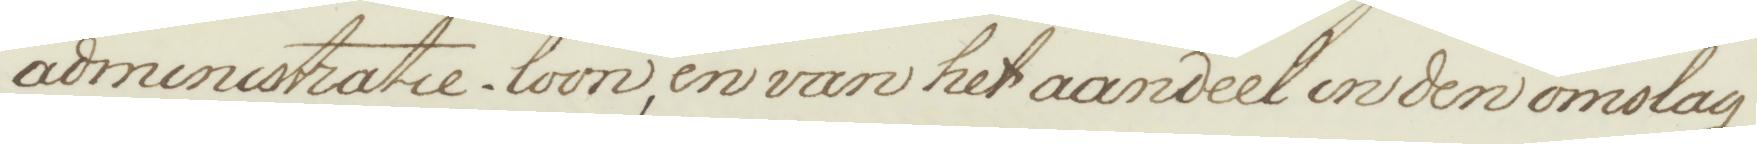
administratie-loon, en van het aandeel in den omslag
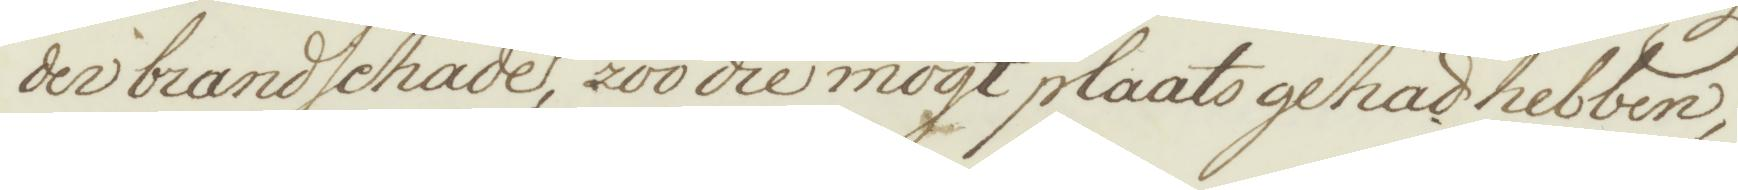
der brandschade, zoo die mogt plaats gehad hebben,
